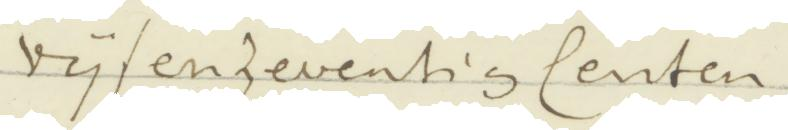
vijfenzeventig Centen
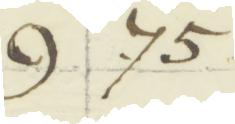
ƒ 9 75
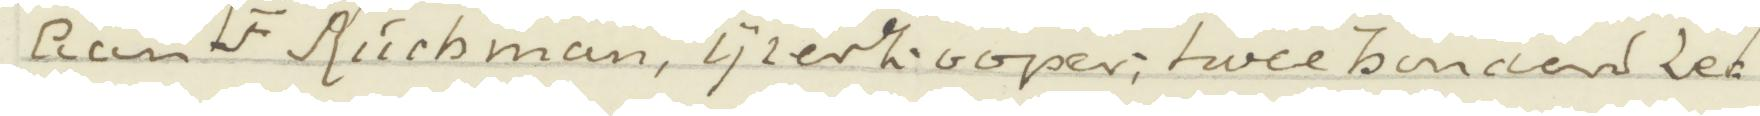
Aan F Ruchman, ijzerkooper, twee honderd ze„
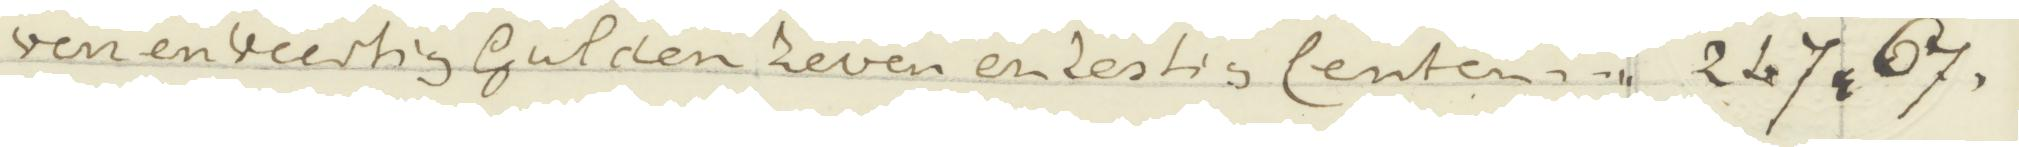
ven en veertig Gulden zeven en zestig Centen - - „ 247 „ 67 .
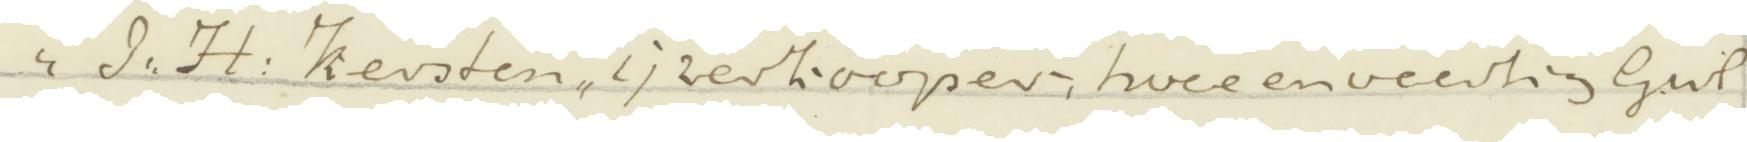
„ I: H: Kersten, ijzerkooper, twee en veertig Gul
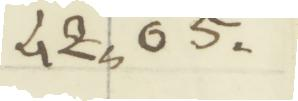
42 „ 05 .
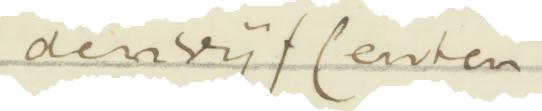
den vijf Centen
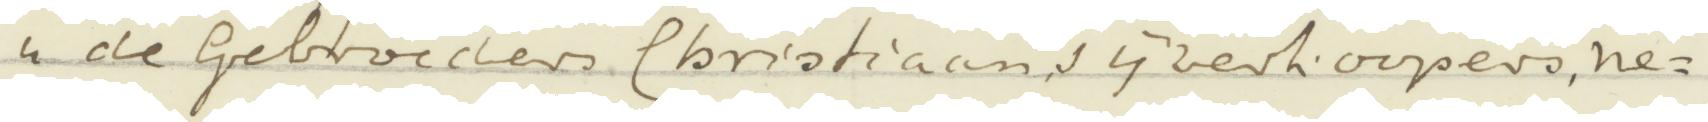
de Gebroeders Christiaans ijzerkoopers, ne=
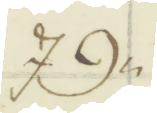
79 „
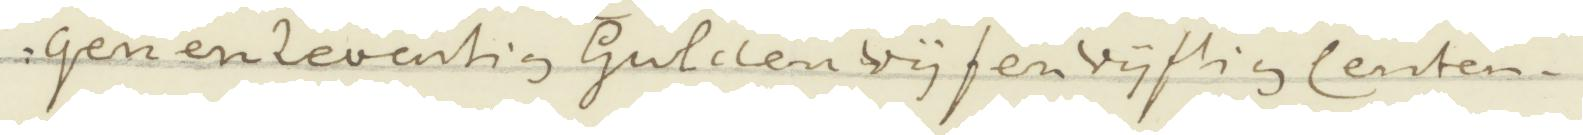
„gen en Zeventig Gulden vijf en vijfig Centen -
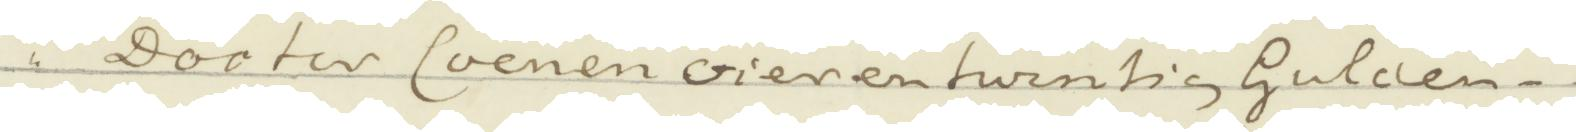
„ Doctor Coenen vier en twintig Gulden -
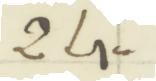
24 „ -
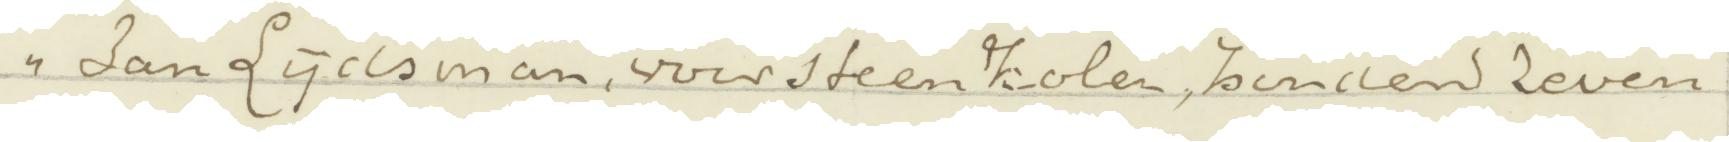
„ Ian Lijdsman, voor steenkolen, honderd Zeven
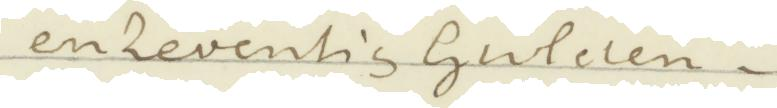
en Zeventig Gulden -
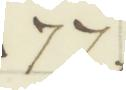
177 „ -
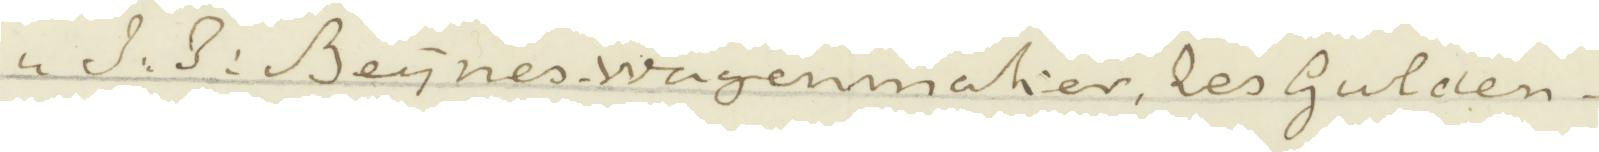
I: I: Beijnes - wagenmaker, Zes Gulden -
